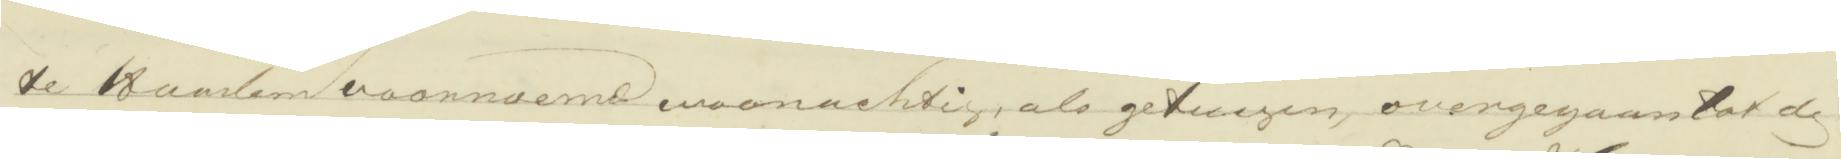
te Haarlem voornoemd woonachtig, als getuigen, overgegaan tot de
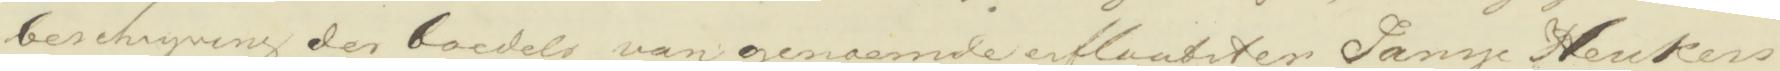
beschryving des boedels van genoemde erflaatster Iansje Heukers
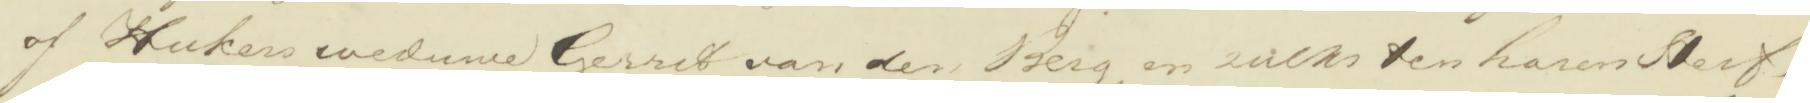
of Hukers weduwe Gerrit van den Berg en zulks ten haren sterf,
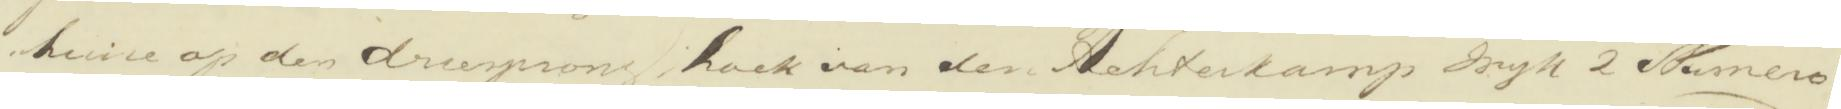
„huize op den driesprong, hoek van den Achterkamp wyk 2 Numero
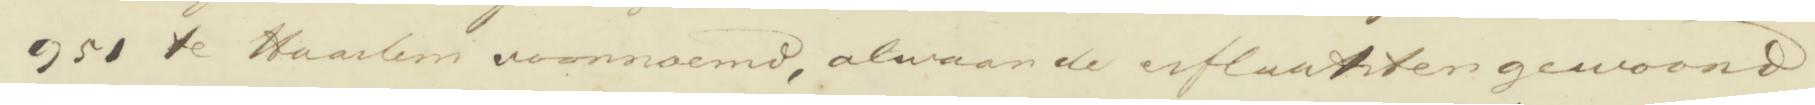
951 te Haarlem voornoemd, alwaar de erflaatster gewoond
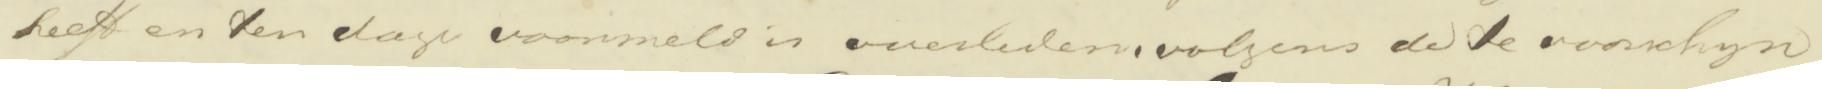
heeft en ten dage voormeld is overleden, volgens de te voorschyn
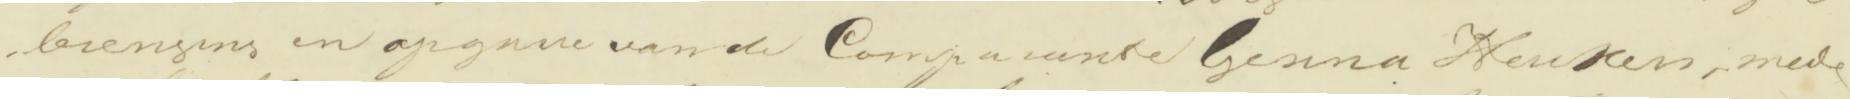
„brenging in opgave van de Comparante Genna Heukers, mede
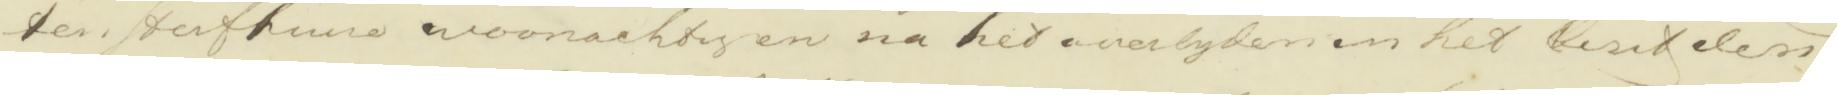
ten sterfhuize woonachtig en na het overlyden in het bezit der
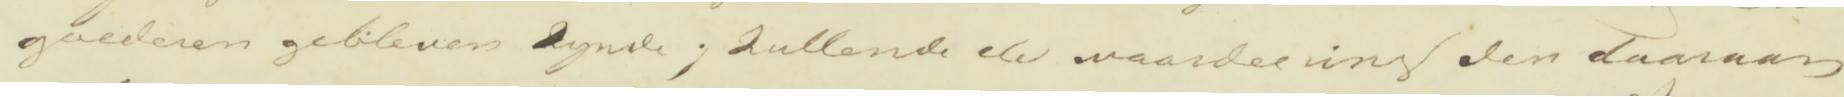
goederen gebleven zynde, zullende de waardeering der daaraan
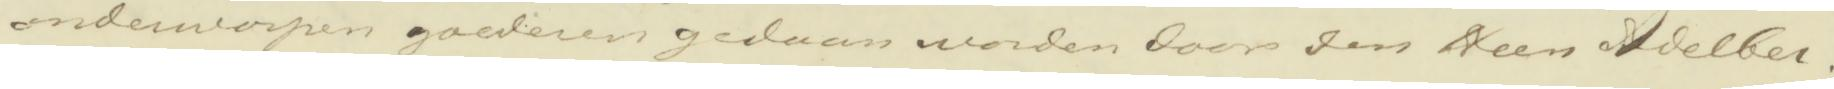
onderworpen goederen gedaan worden door den heer Adelber.
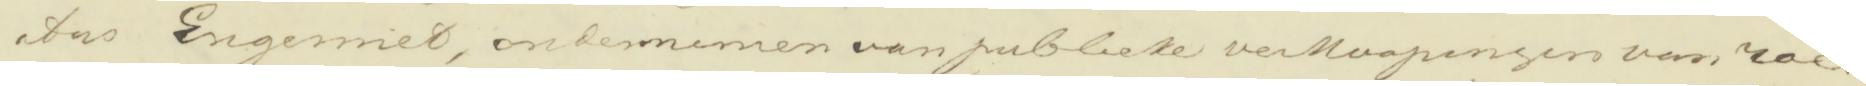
tus Engesmet, ondernemer van publieke verkoopingen van roe.
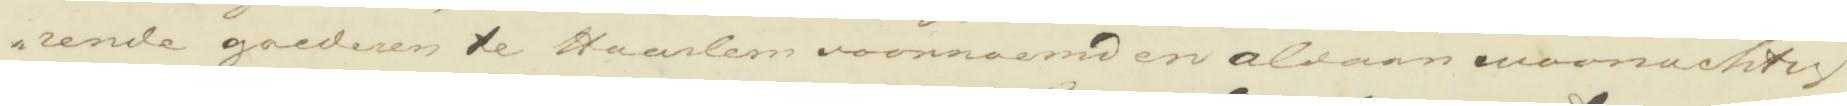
„rende goederen te Haarlem voornoemd en aldaar woonachtig
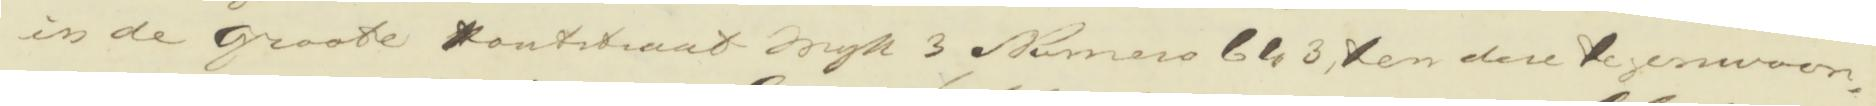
in de groote Houtstraat wyk 3 Numero 643, ten deze tegenwoor„
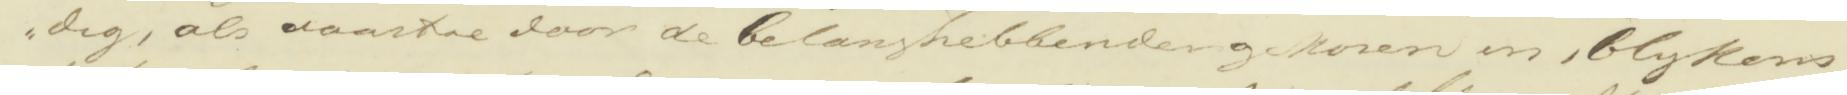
„dig, als daartoe door de belanghebbenden gekozen en, blykens
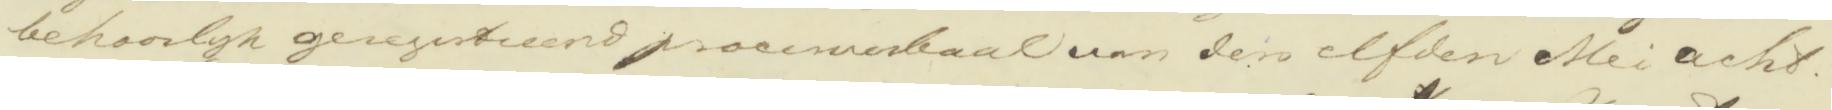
behoorlyk geregistreerd procesverbaal van den elfden Mei acht.
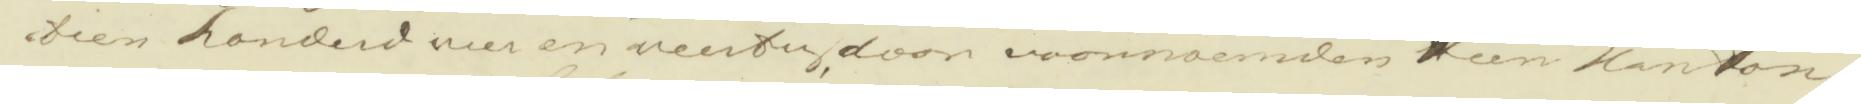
tien honderd vier en veertig door voornoemden heer Kanton,
